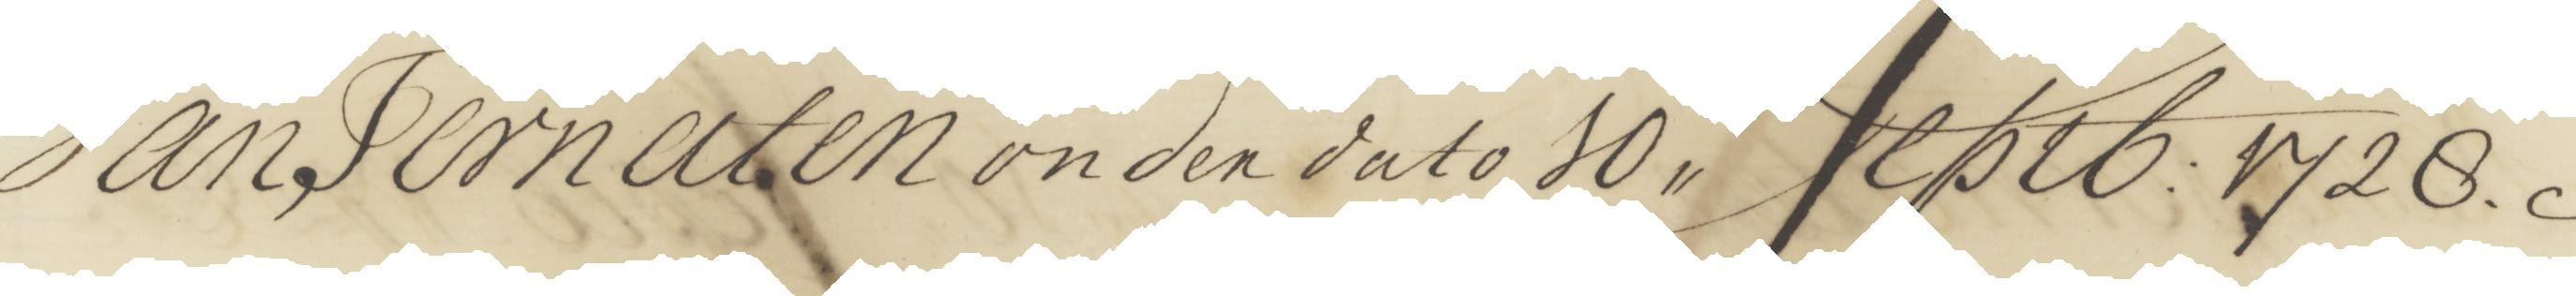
Van Ternaten onder dato 10„e Septb: 1728.-
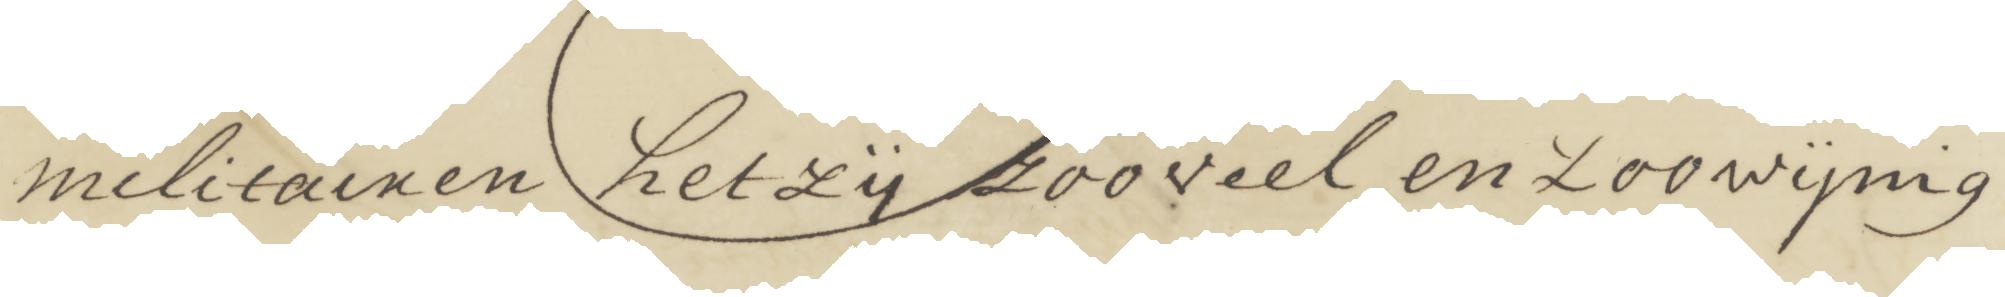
militairen het zij zoo veel, en zoo wijnig
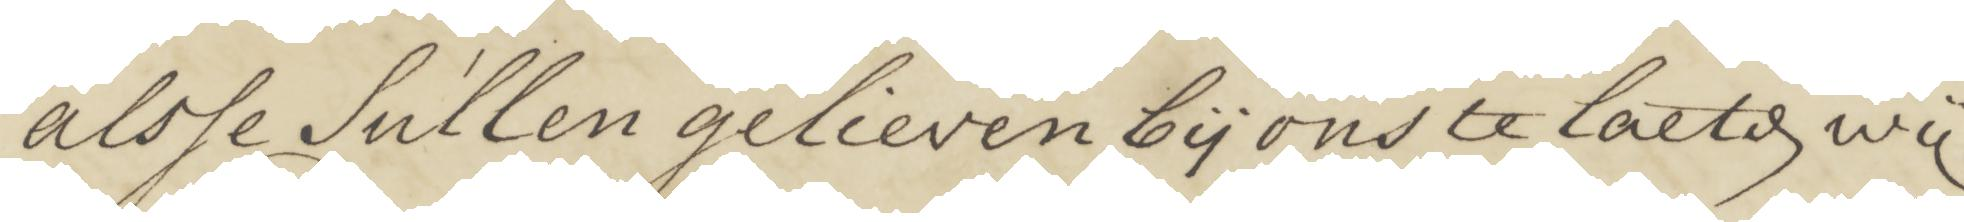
alsse Sullen gelieven bij ons te laeten wij
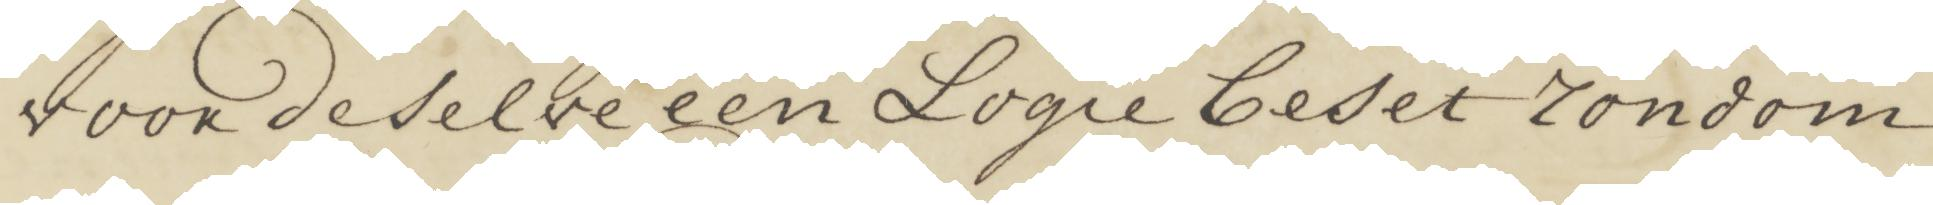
voor deselve een Logie beset rondom
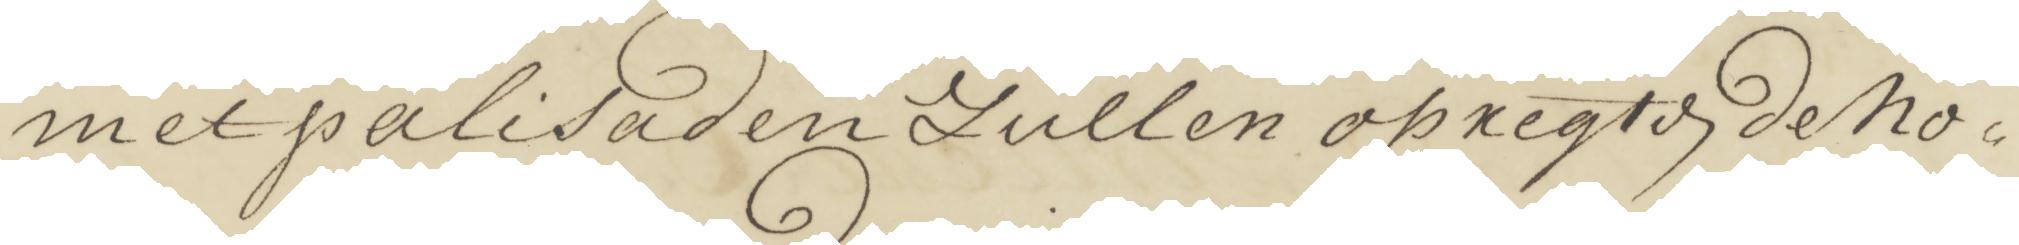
met palisaden Zullen opregten de No„
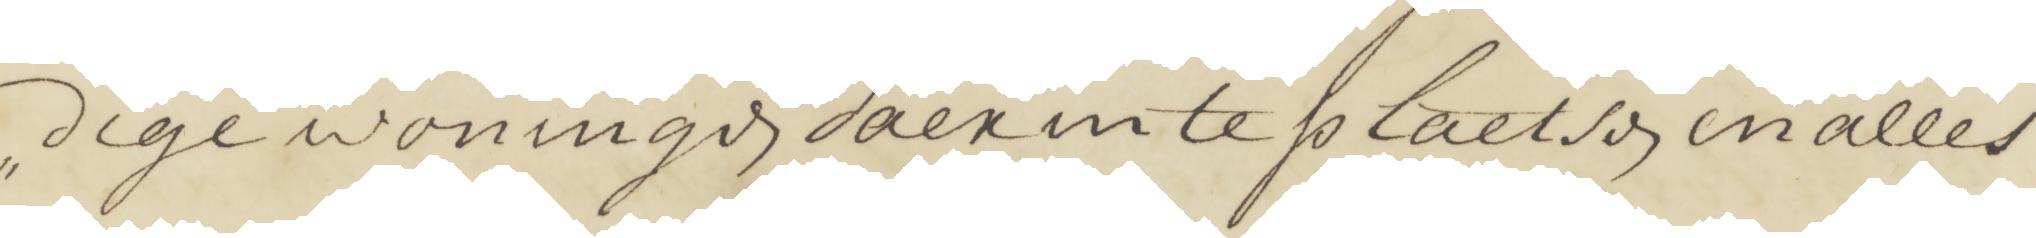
„dige woningen daer in te plaetsen en alles
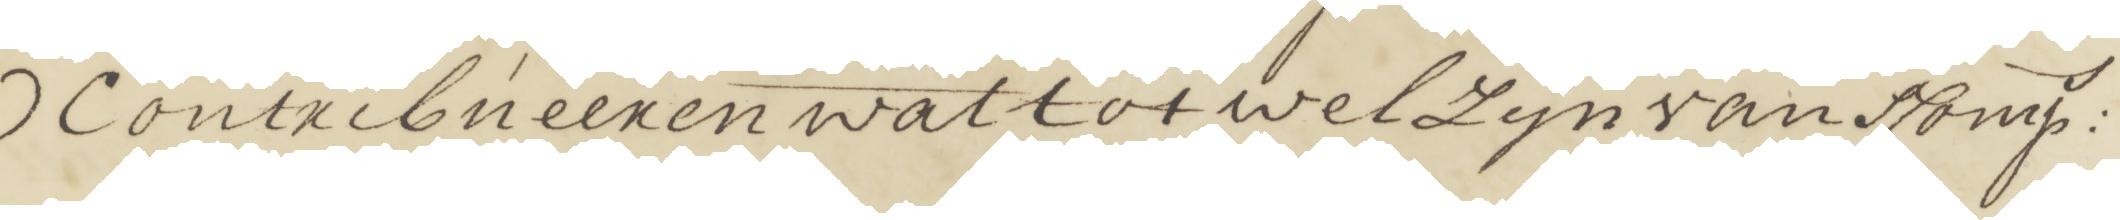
contribueeren wat tot wel zijn van 'sComp:s
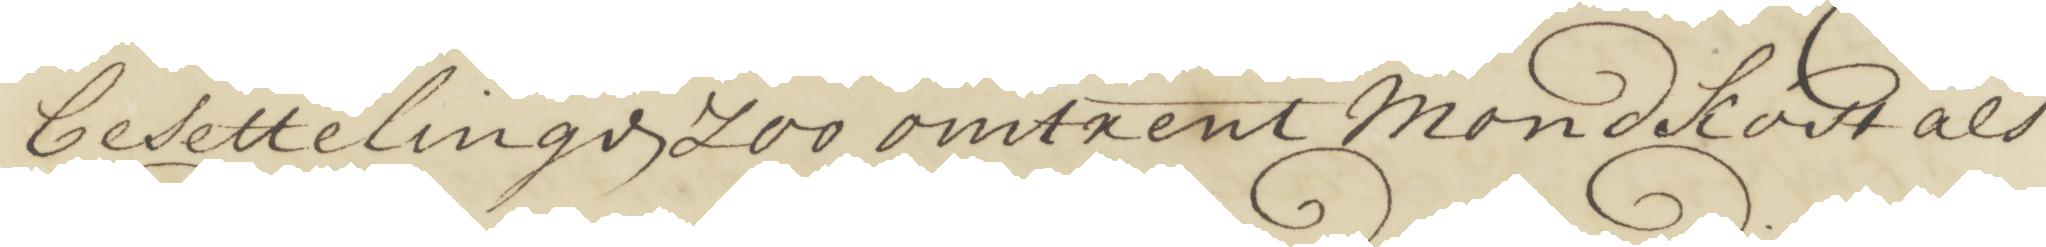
besettelingen zoo omtrent mondkost als
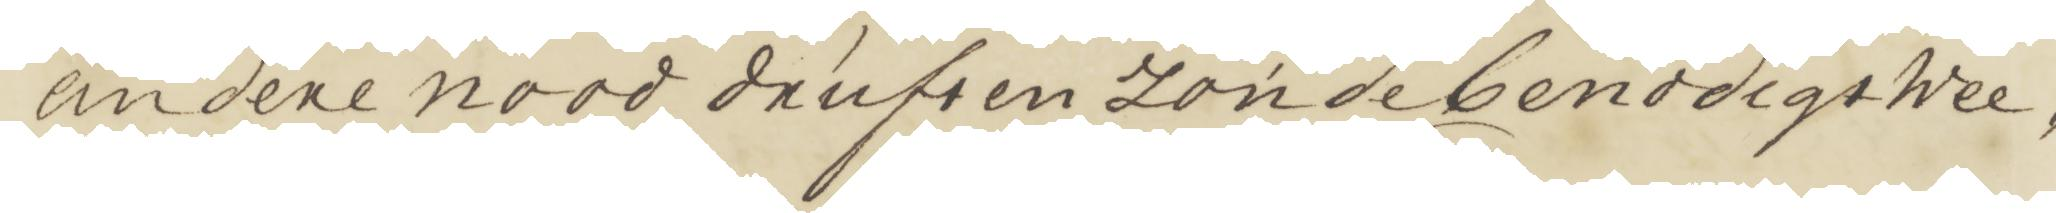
andere nood druften zoude benodigt wee„
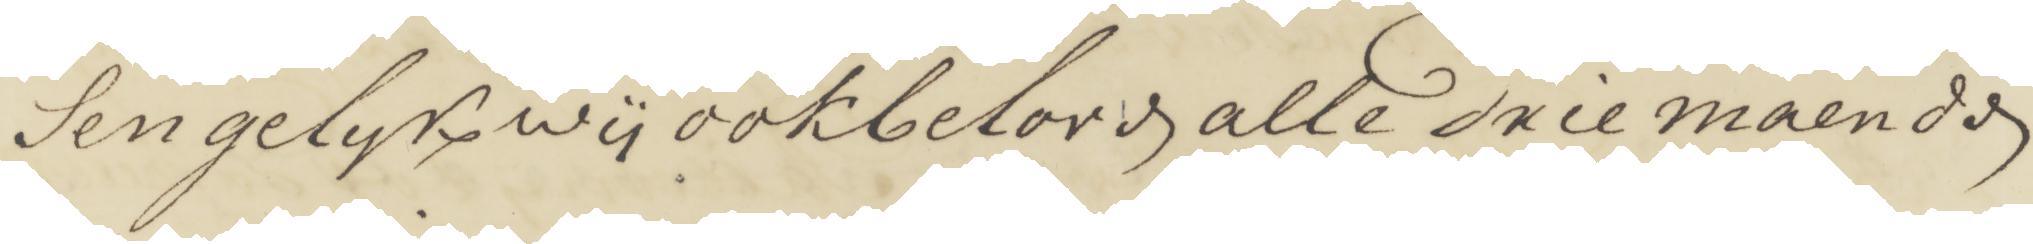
Sen gelyk wij ook beloven alle drie maenden
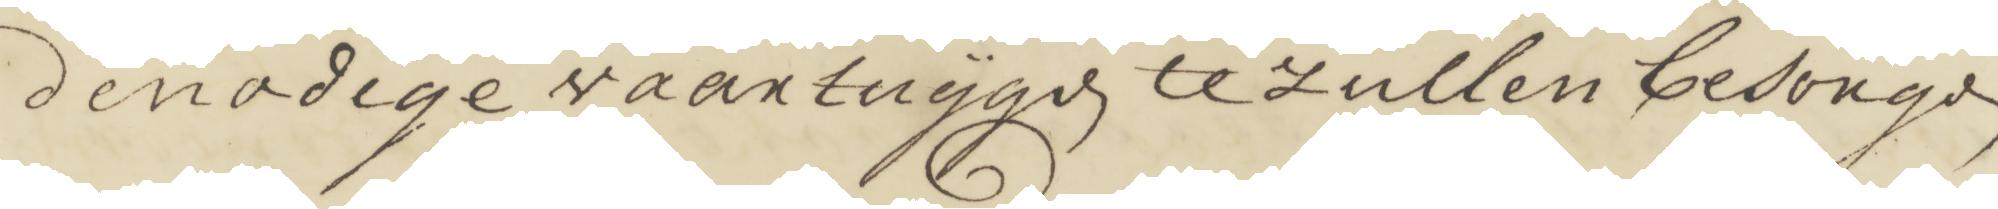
de nodige vaartuijgen te zullen besorgen
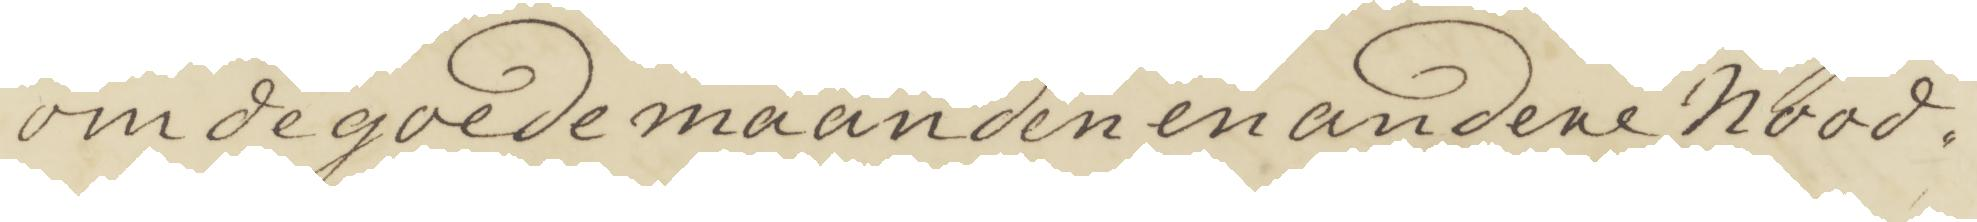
om de goede maanden en andere Nood„
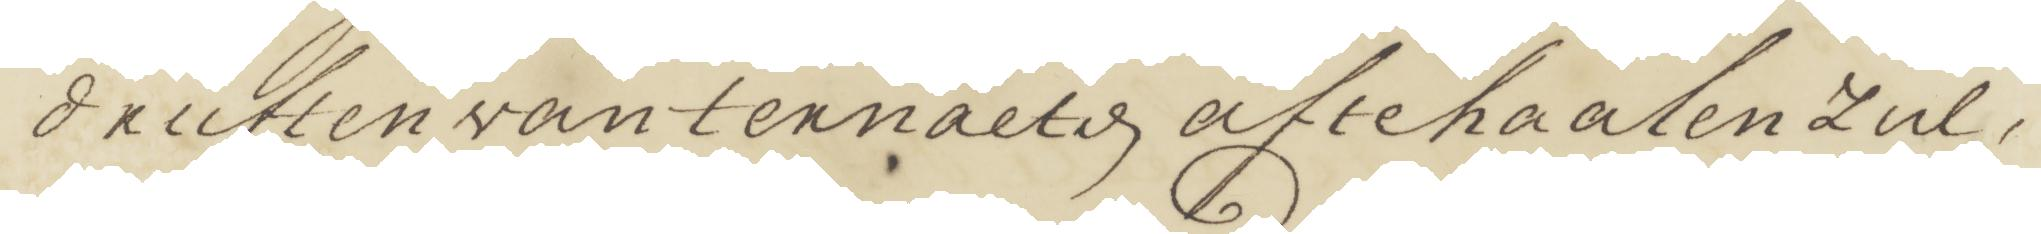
druften van ternaeten af te haalen Zul,
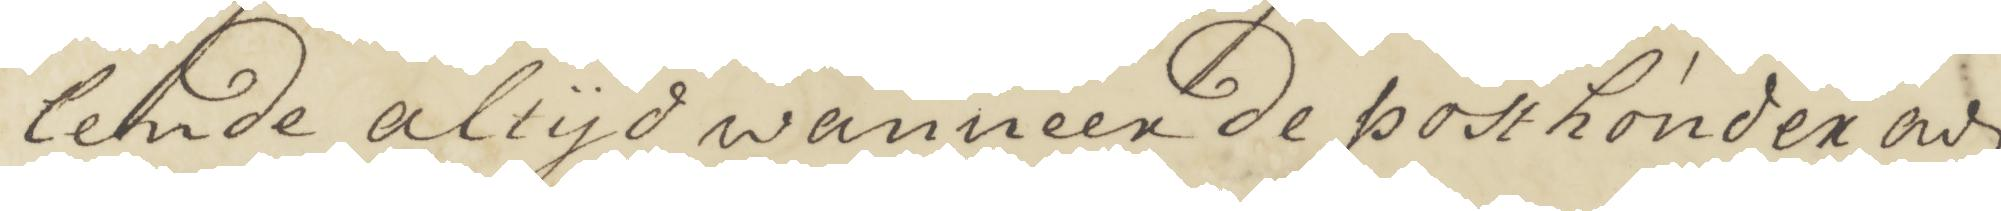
lende altijd wanneer de posthouder aen
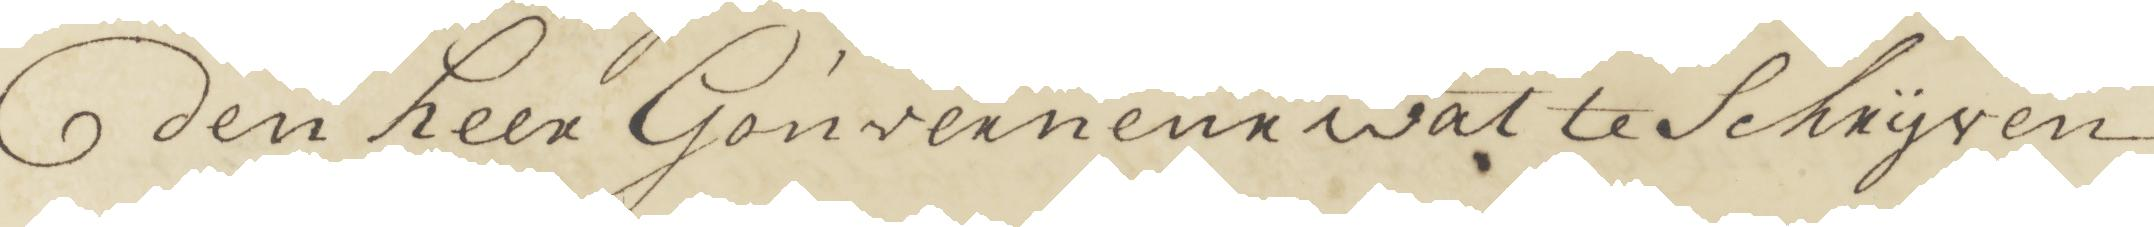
den heer Gouverneur wat te Schrijven
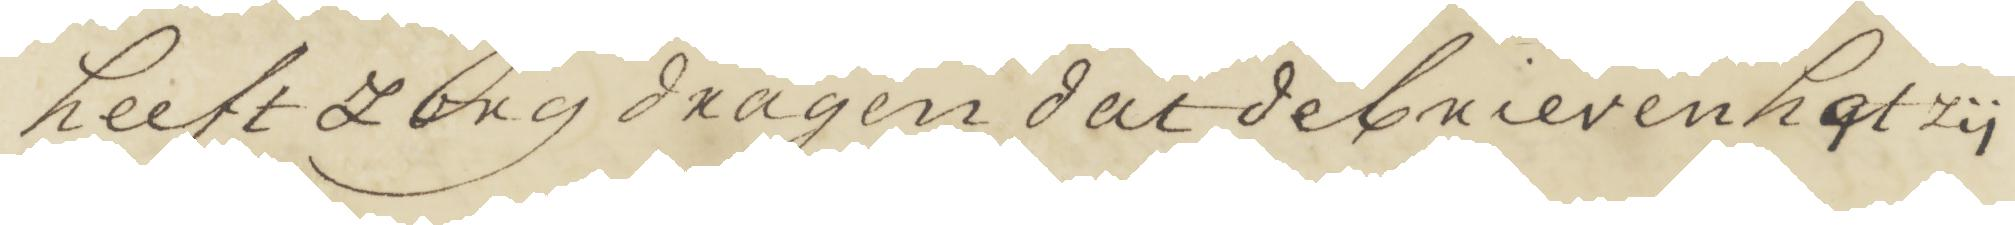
heeft zorg dragen dat de brieven het zij
